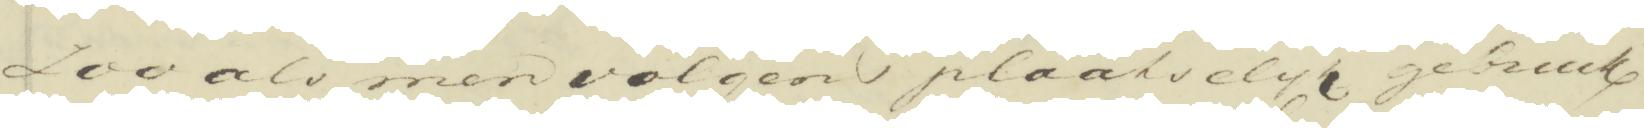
zoo als men volgens plaatselyk gebruik
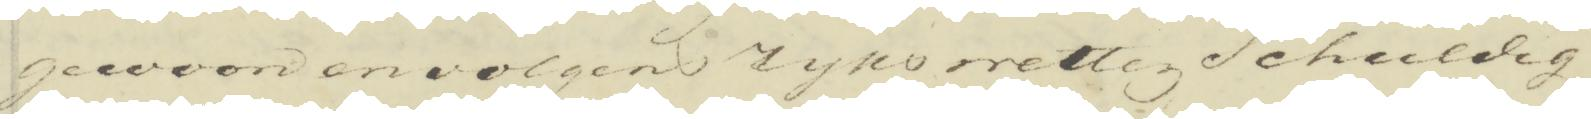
gewoon en volgens ryks wetten schuldig
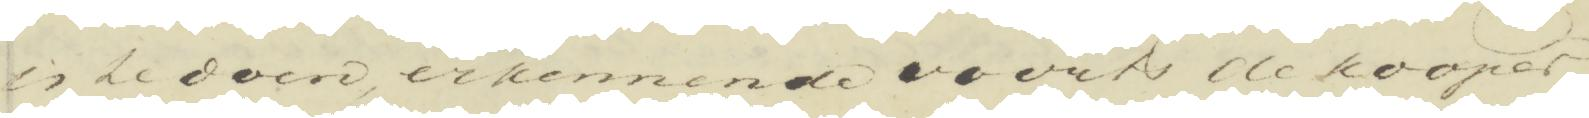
is te doen, erkennende voorts de kooper
